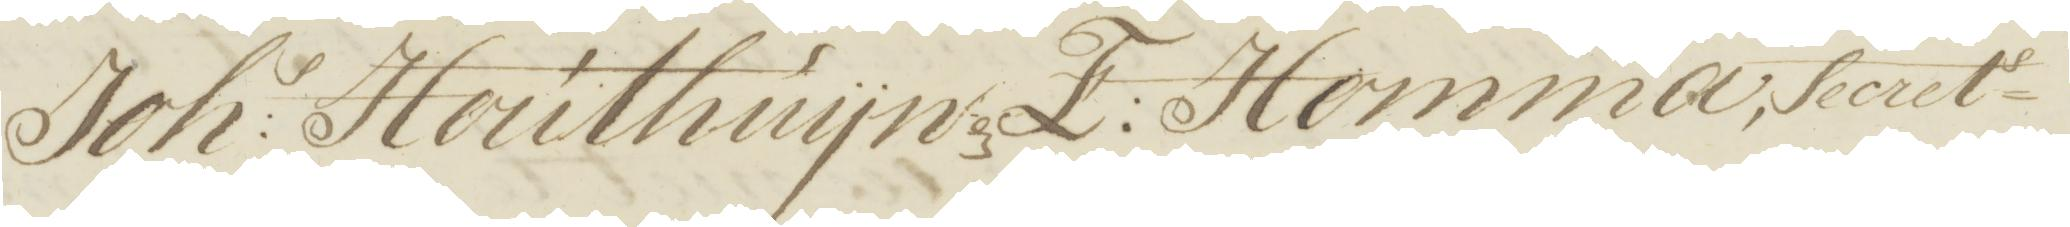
Joh:s Houthuijn en E: Homma, secret=s
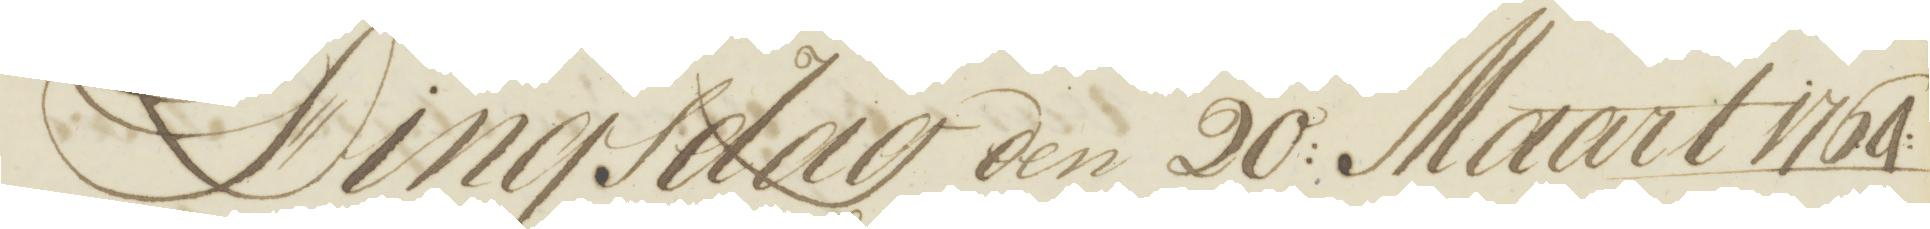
Dingsdag den 20: Maart 1764:
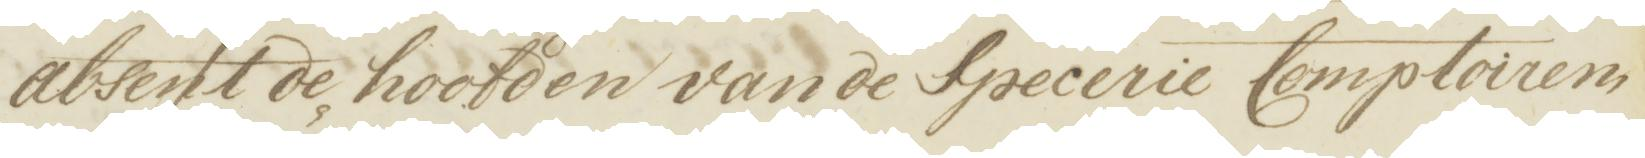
absent de hoofden van de specerie Comptoiren
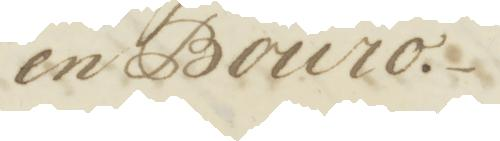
en Bouro. -
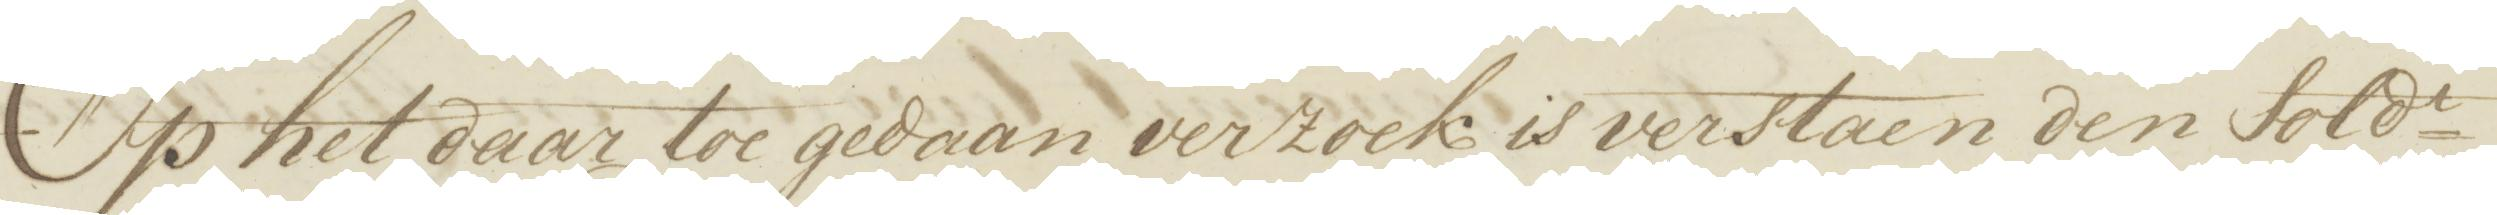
Op het daar toe gedaan verzoek is verstaen den sold=t
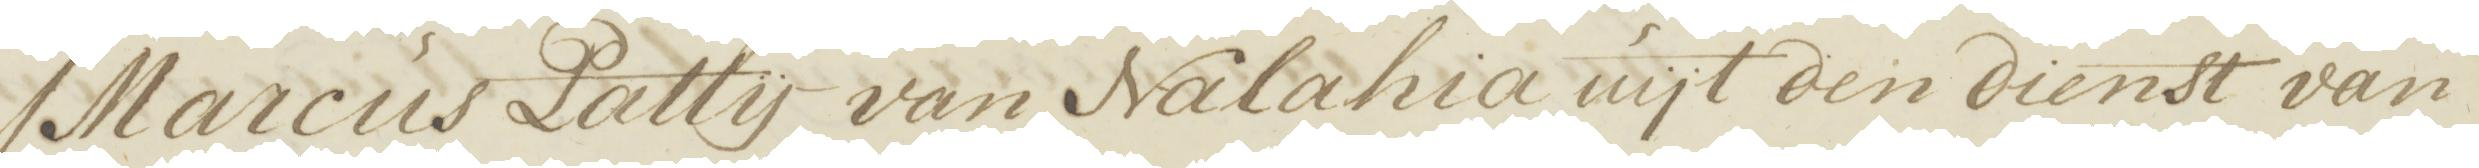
Marcus Pattij van Nalahia uijt den dienst van
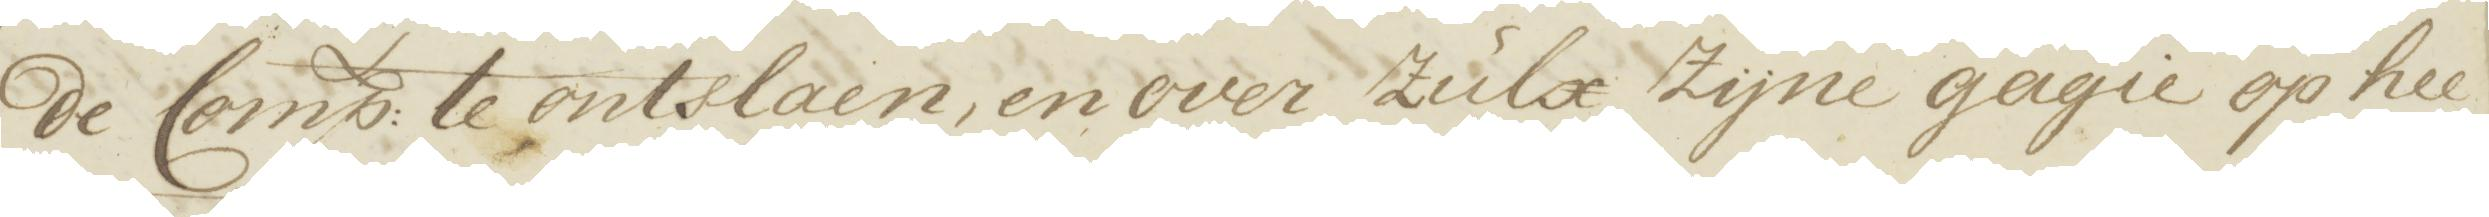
de Comp: te ontslaen, en over zulx zijne gagie op hee
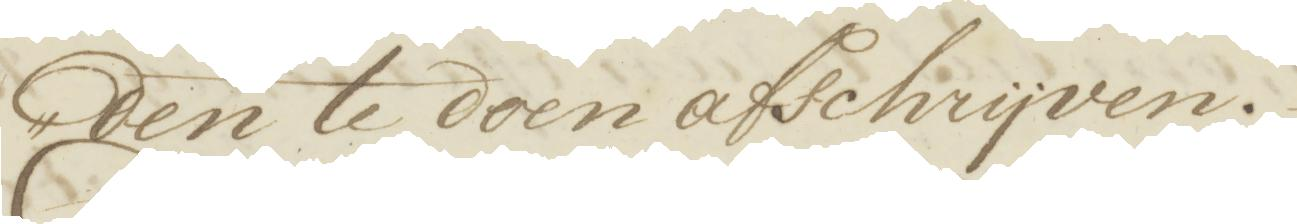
„den te doen afschrijven.
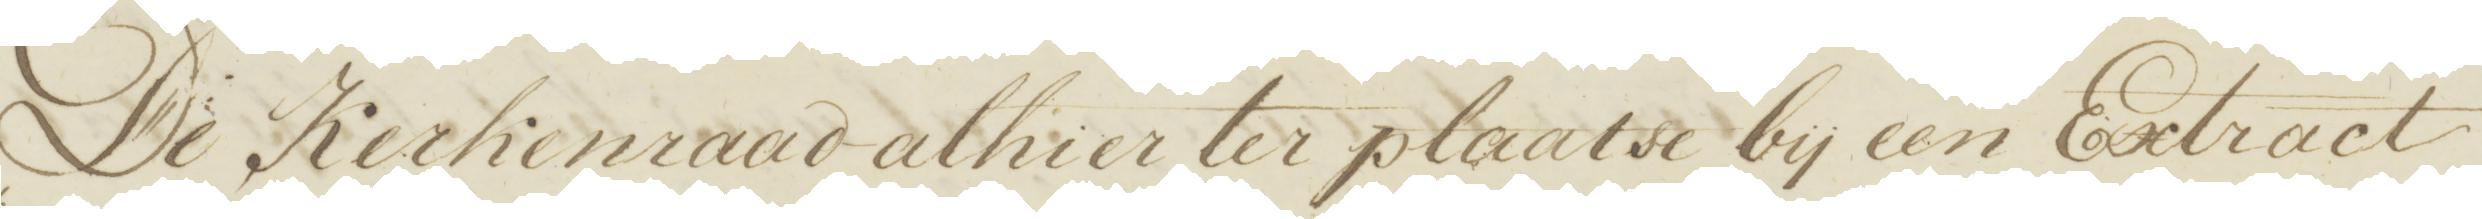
De kerkenraad alhier ter plaatse bij een Extract
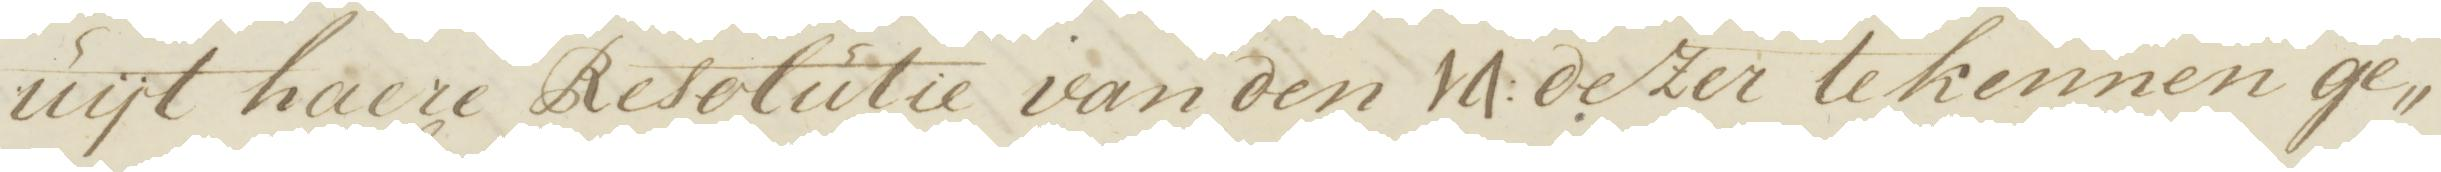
uijt haere Resolutie van den 14: dezer te kennen ge„
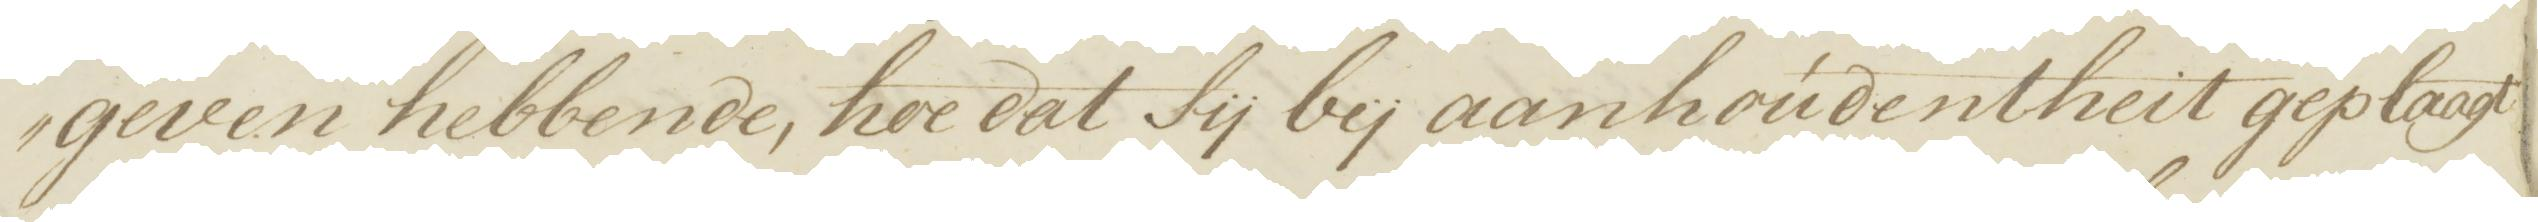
„geven hebbende, hoe dat Sij bij aanhoudentheit geplaagt
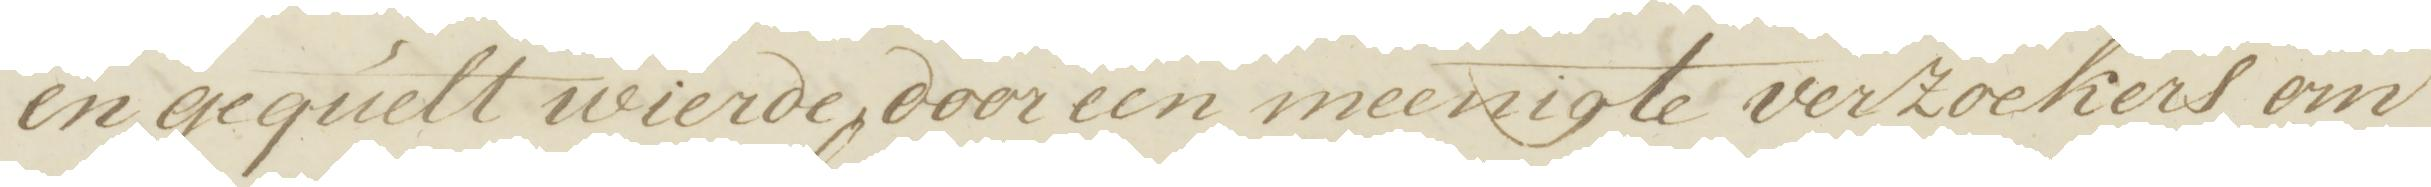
en gequelt wierde, door een meenigte verzoekers om
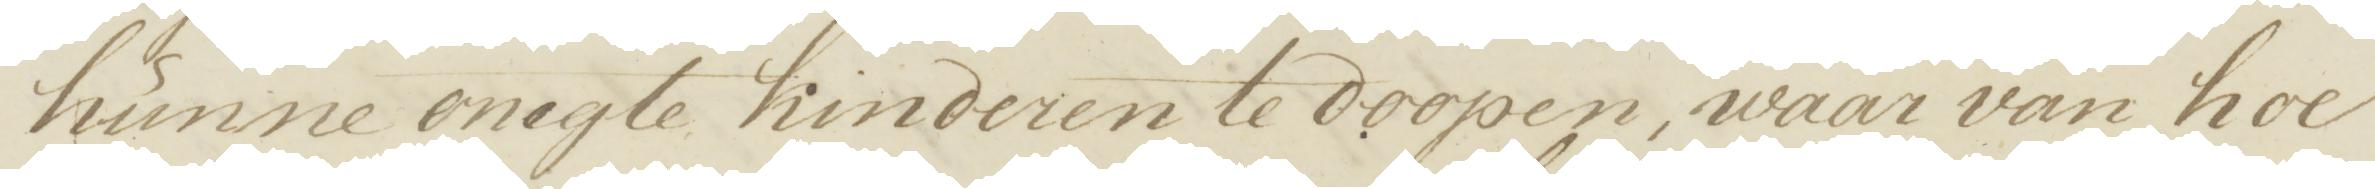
hunne onegte kinderen te doopen, waar van hoe
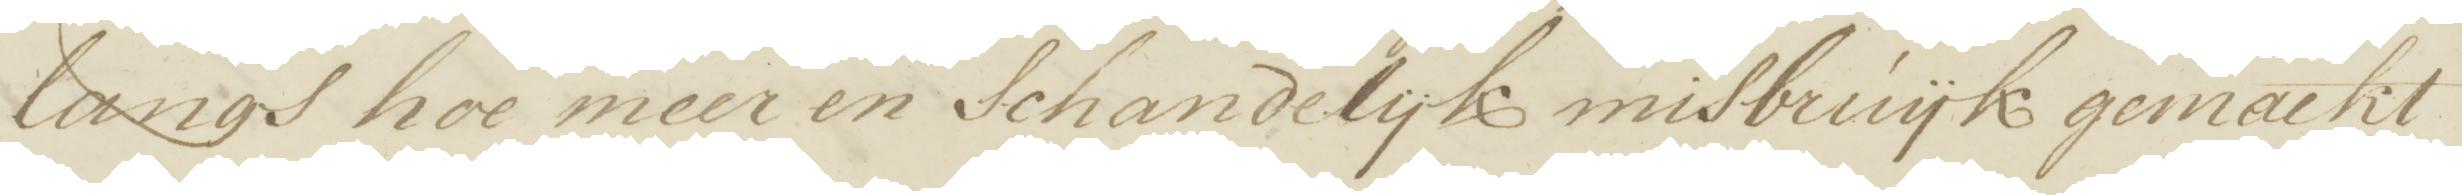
langs hoe meer en schandelijk misbruijk gemaekt
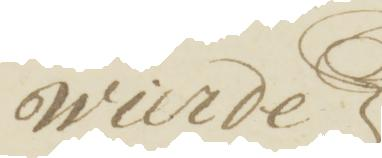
wierde
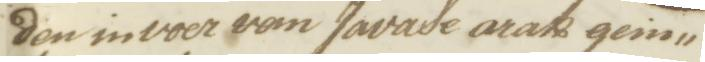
den invoer van Javase arak gein„
